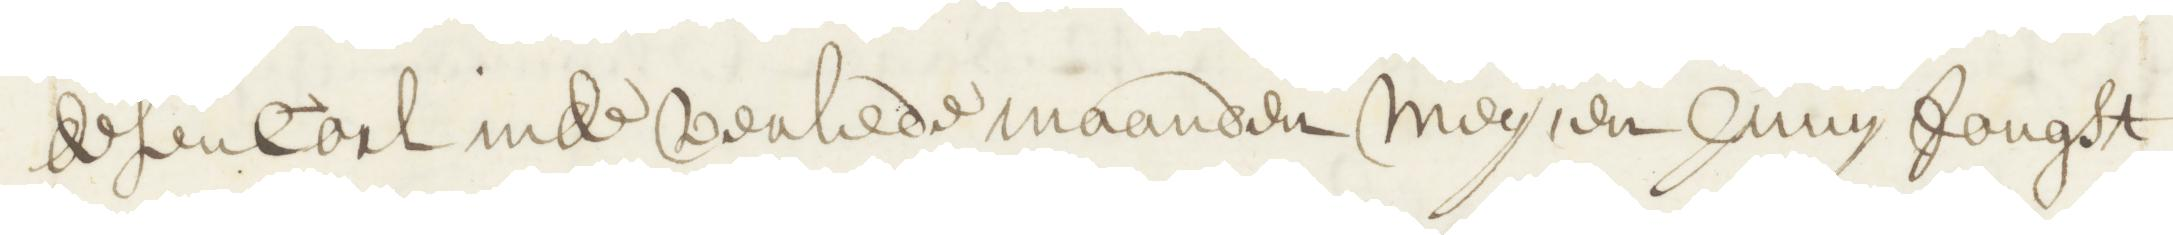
desen Corl in de verlede maanden meij, en Junij Jongst
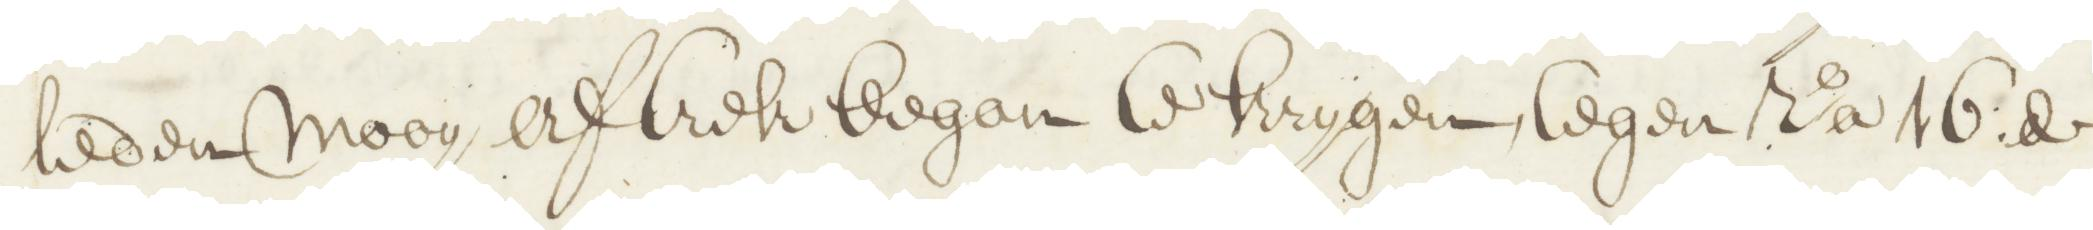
leden mooij aftrek begon te krijgen, tegen, ro/a 16: de
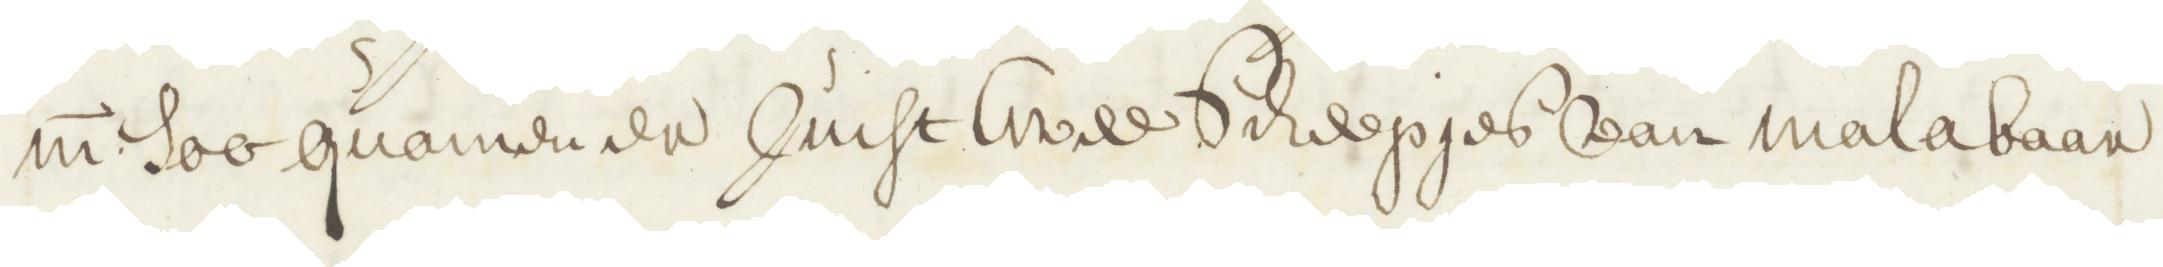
in. soo quamen er juist twee scheepjes van malabaar
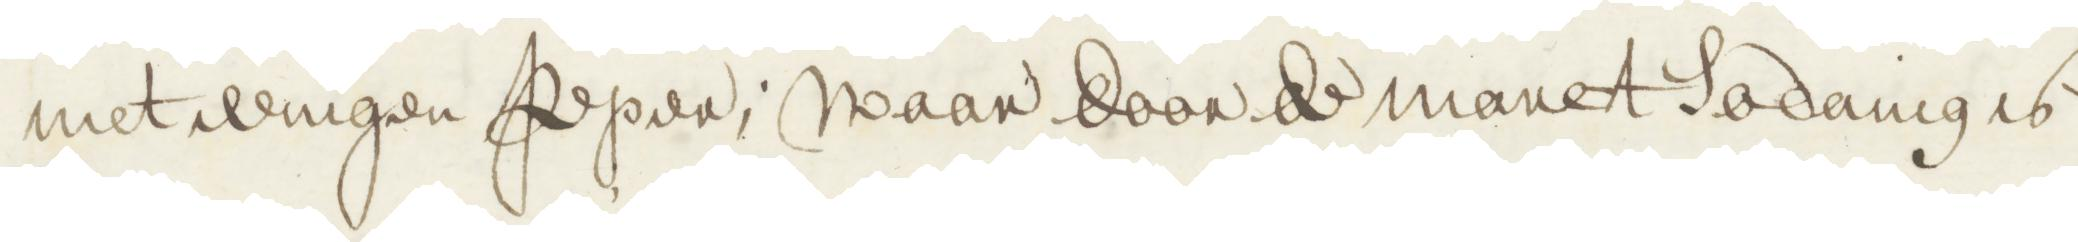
met eenigen Peper; waar door de marct sodanig is
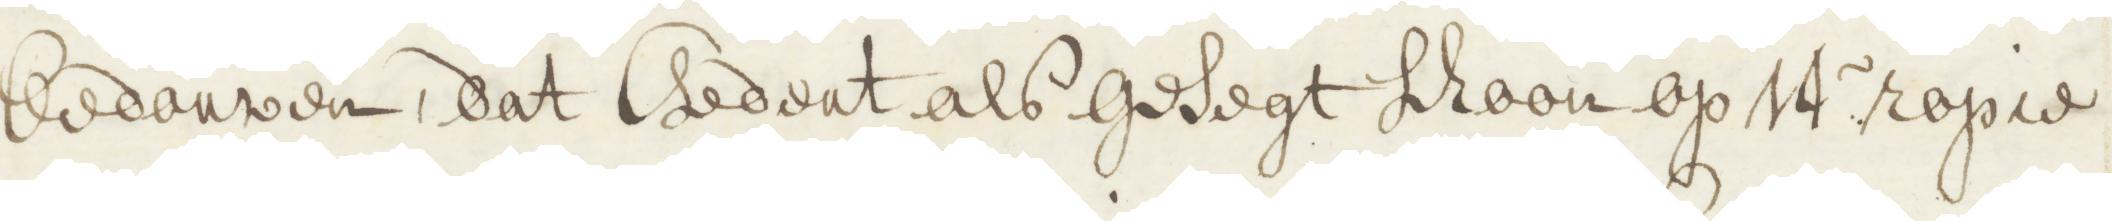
bedorven, dat t sedert als gesegt schoon op 14:' ropie
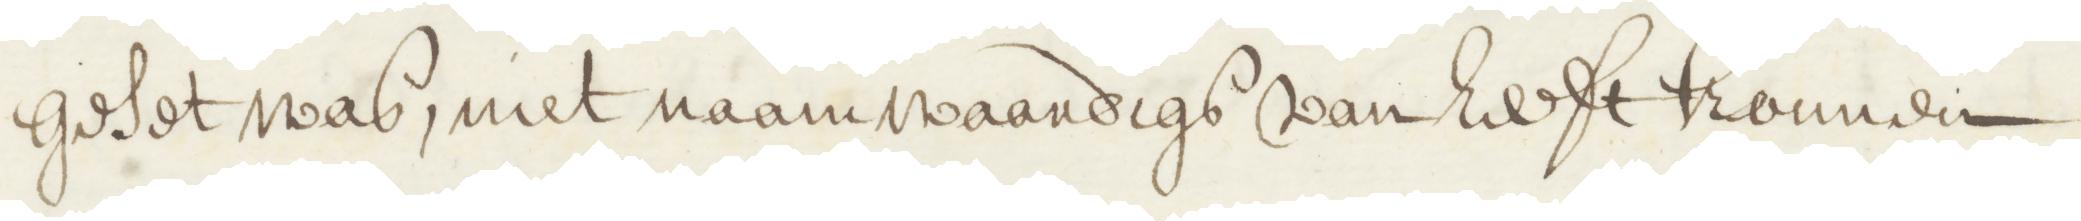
geset was, niet naam waardigs van heeft konnen
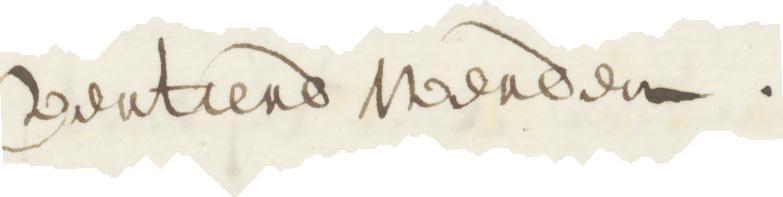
vertierd werden.
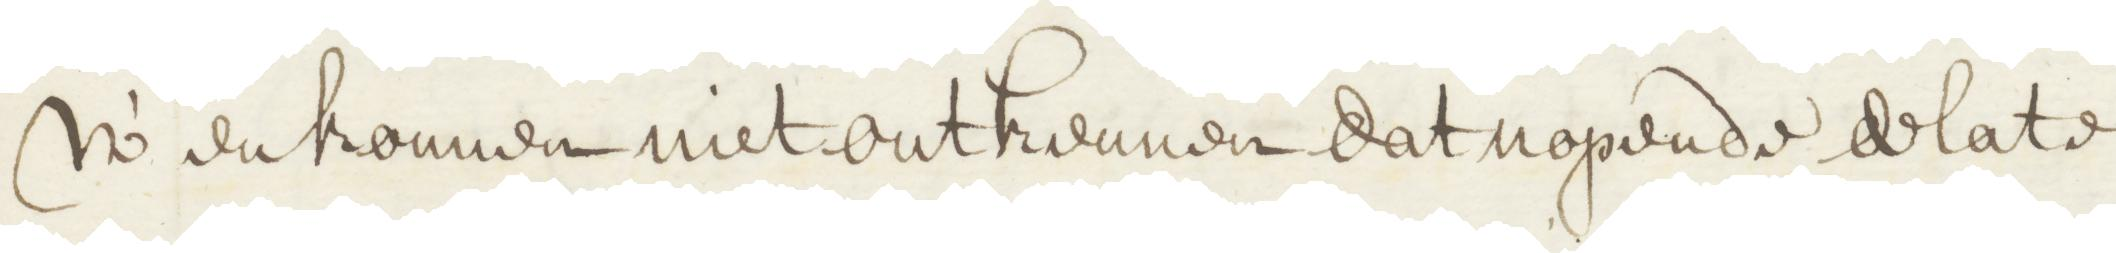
w' en konnen niet ontkennen dat nopende de late
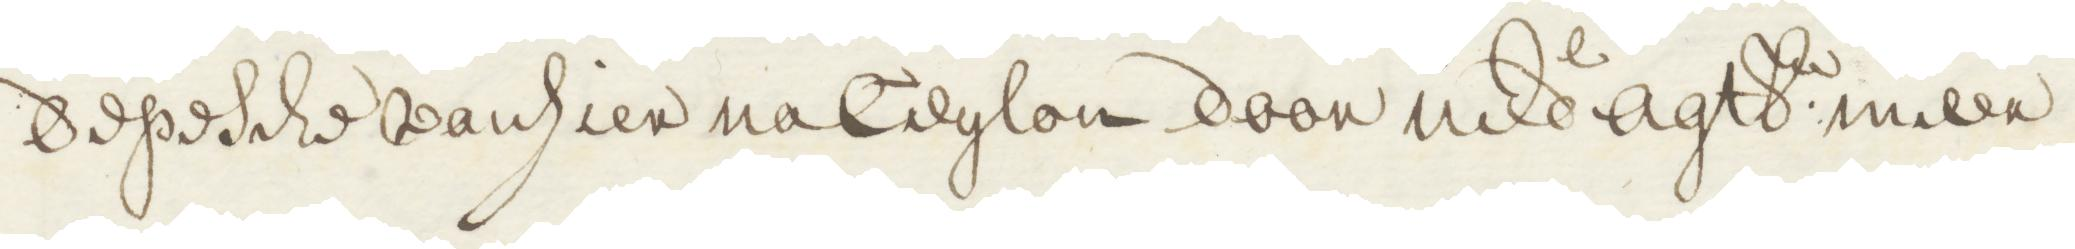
depesche van hier na Ceijlon door uEd:l agtb:e meer
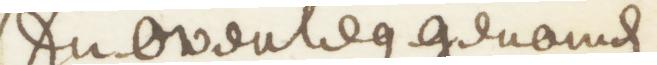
Jn overleg genomen
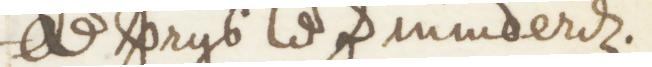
de prijs te verminderen.
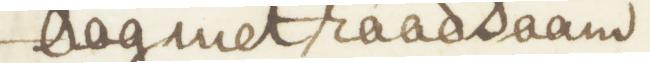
dog niet raadsaam
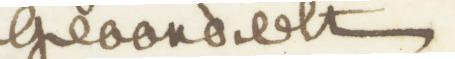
geoordeelt
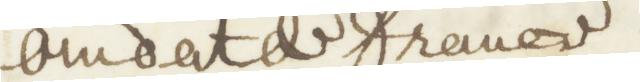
omdat de france
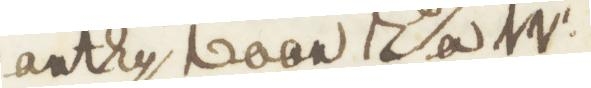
arthij voor r o/a 11:
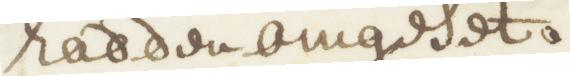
hadden omgeset.
